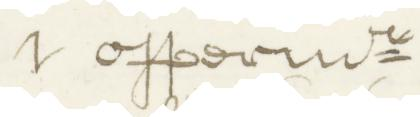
1 opperm=r
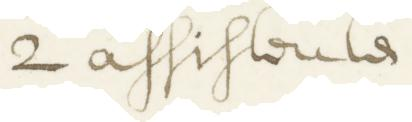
2 assistenten
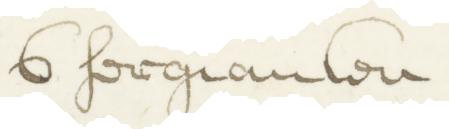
6 sergianten
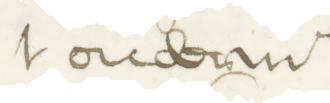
1 onderm
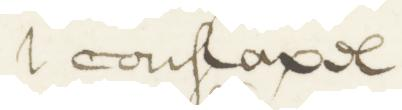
1 constapel
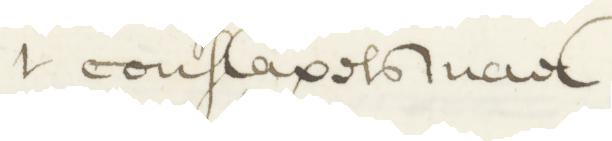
1 constapels maet
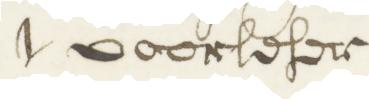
1 voorleser
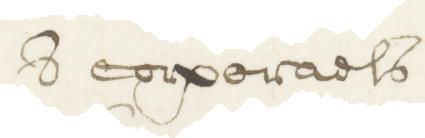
8 corporaels
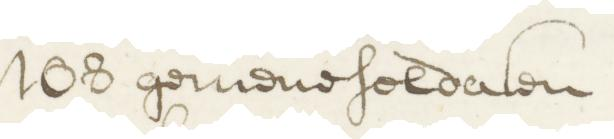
108 gemene soldaten
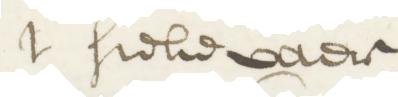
1 sieke vaer
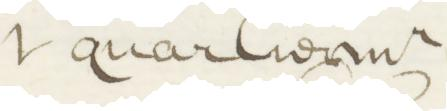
1 quartiermr
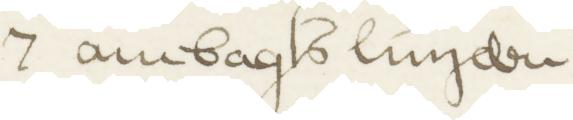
7 ambagtsluyden
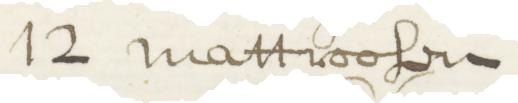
12 mattroosen
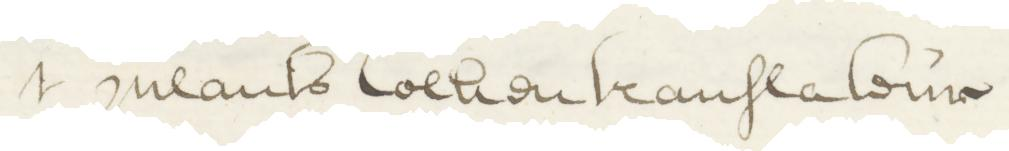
1 jnlants tolken translateur
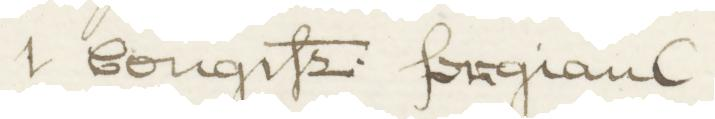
1 bougisz: sergiant
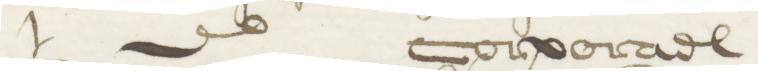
1 do corporael
